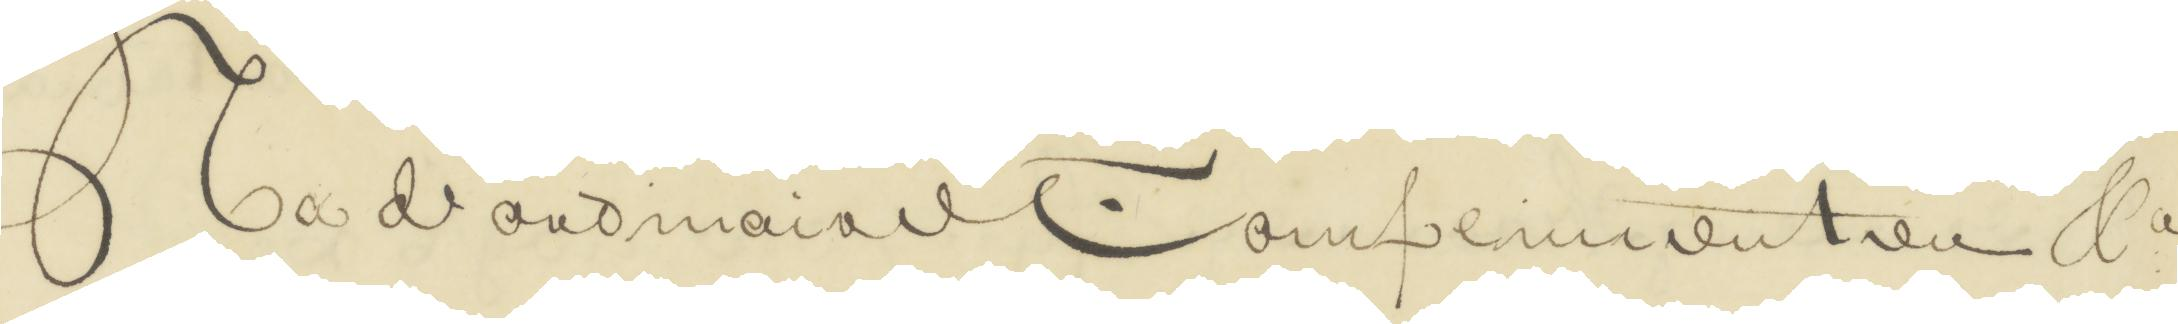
Na de ordinaire Complimenten &:a
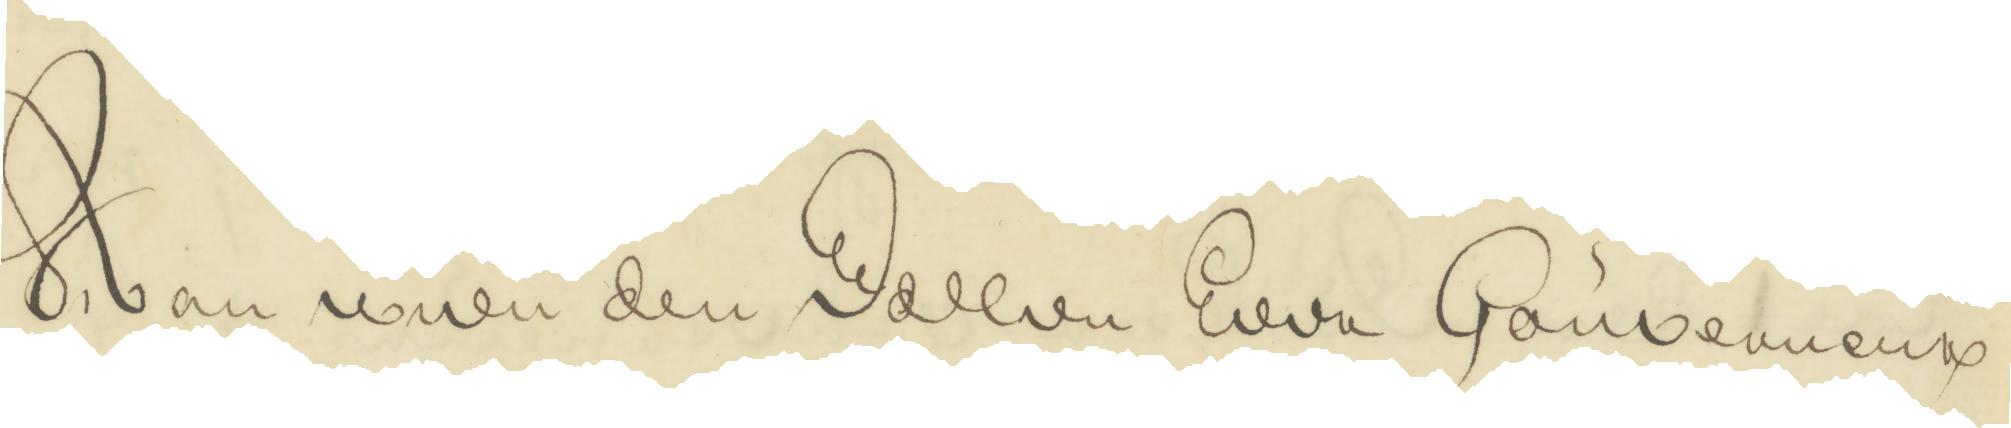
Aan wien den Edelen heer Gouverneur
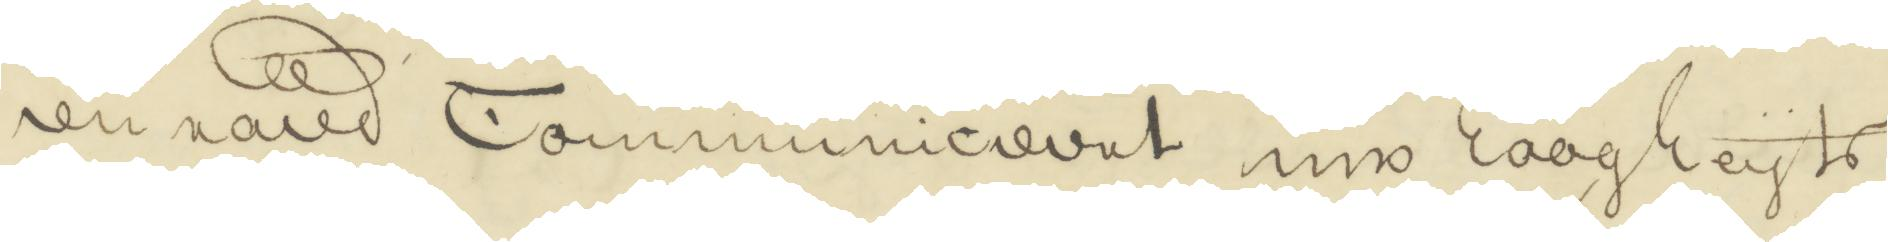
en raed Communiceert uw hoogheijts
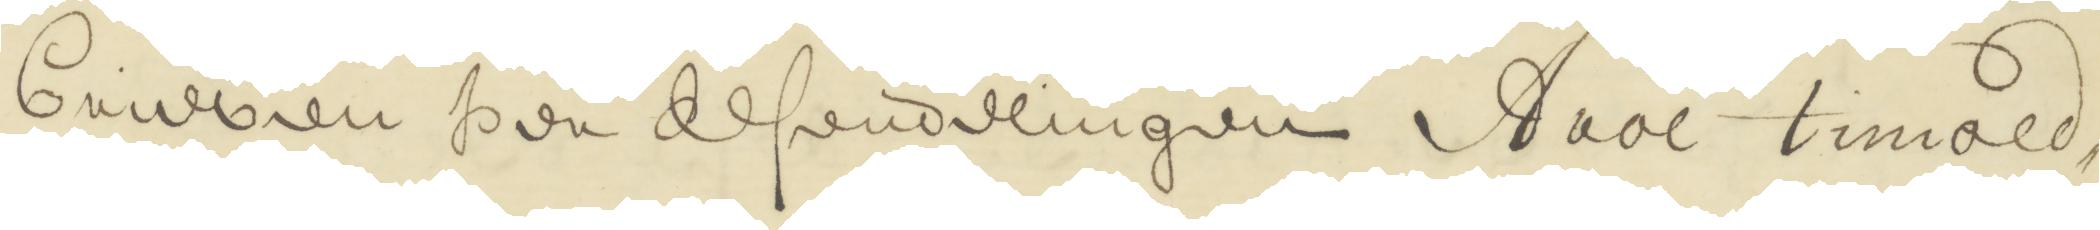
brieven per de sendelingen Aroe timoed„
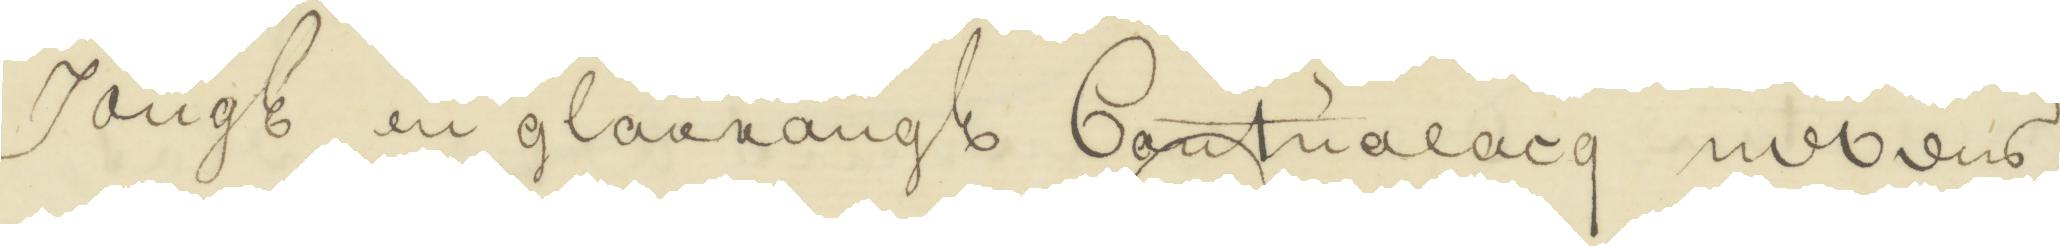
Jongh en glaerangh bontualacq nevens
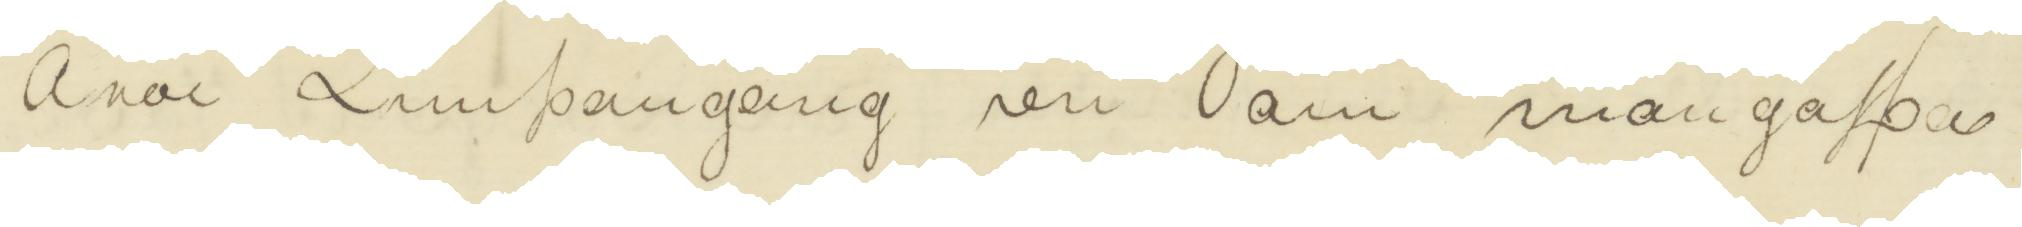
Aroe Limpangang en dain mangappa
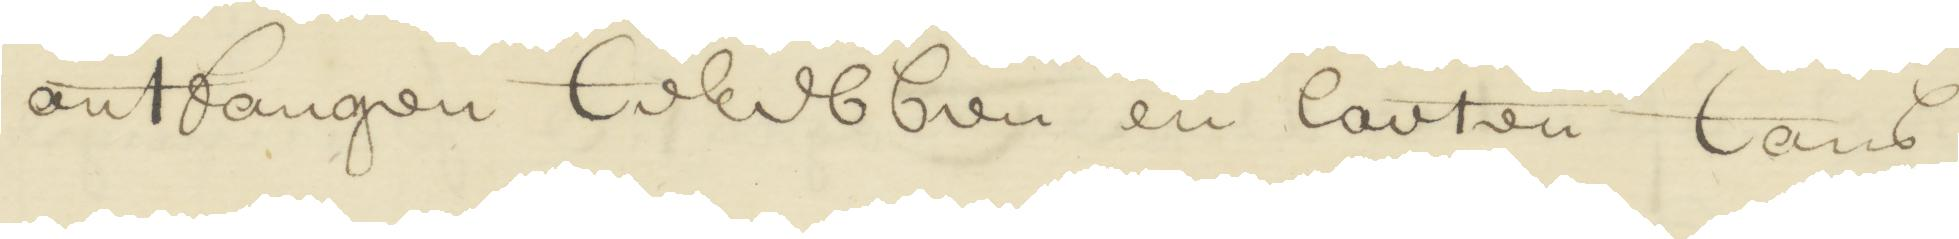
ontfangen te hebben en laeten tans
